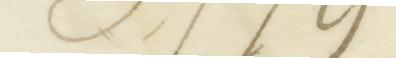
2779
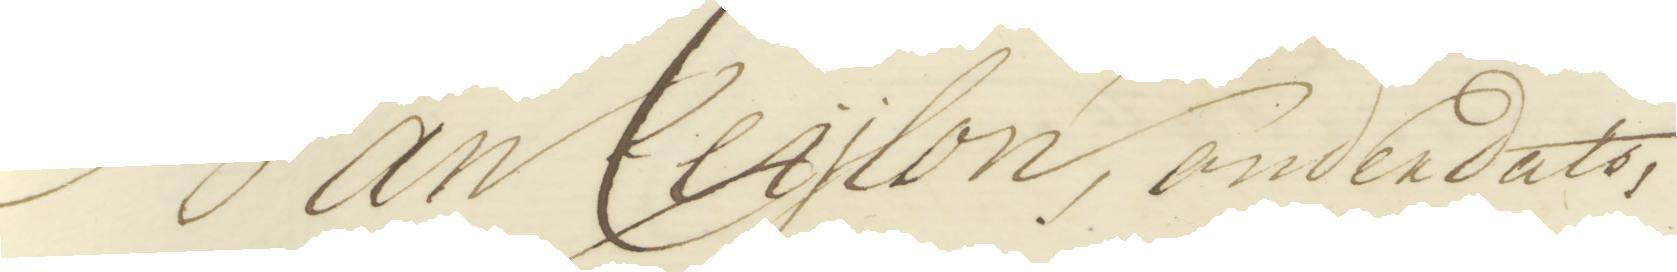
Van Ceijlon, onder dato,
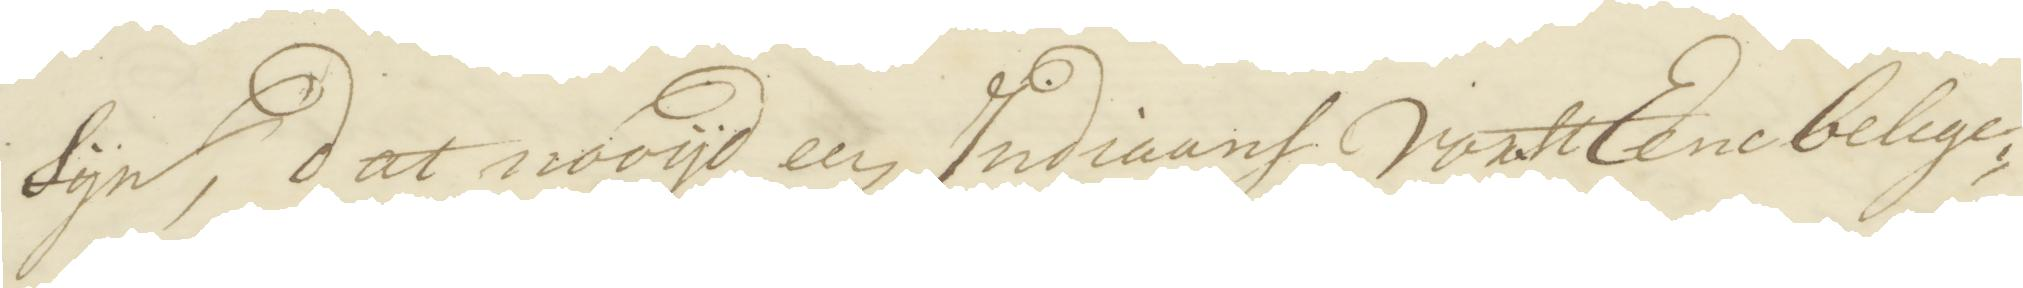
sijn, dat nooijd een Jndiaans vorst Eene belege„
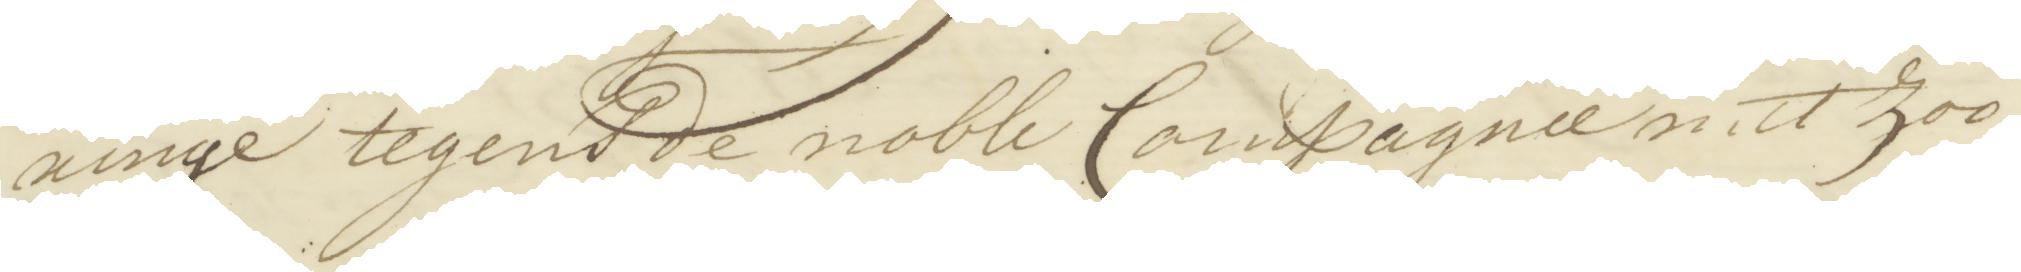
ringe tegens de noble Compagnie met zoo
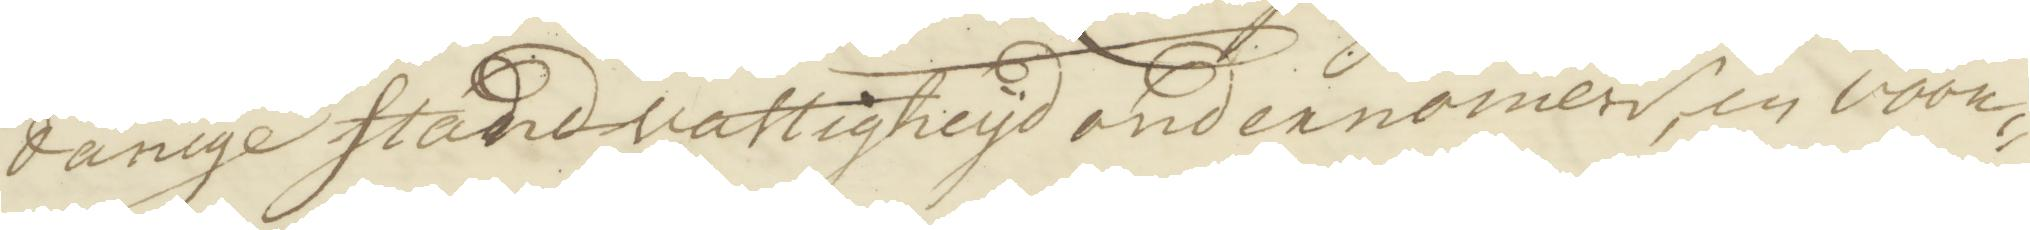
danige stand vastigheijd ondernomen, en voor„
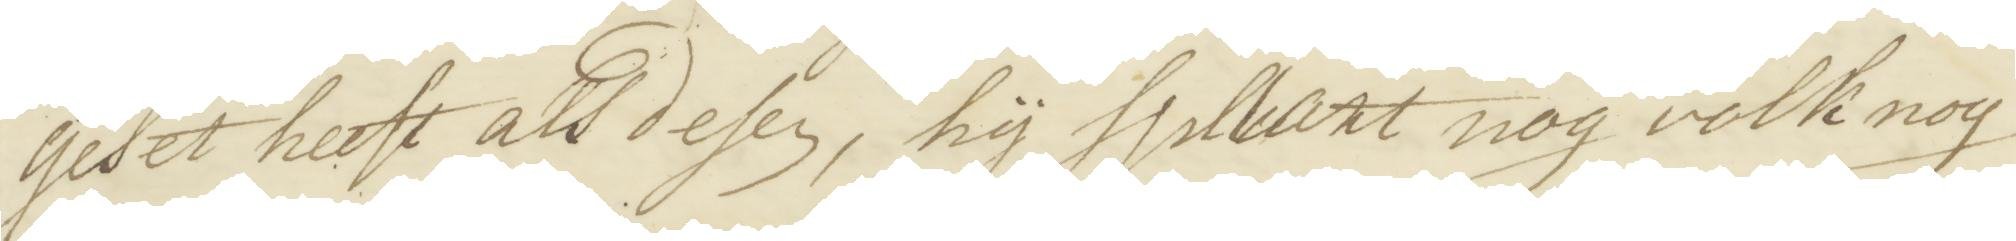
geset heeft als desen, hij spaart nog volk nog
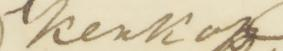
^ kerk op
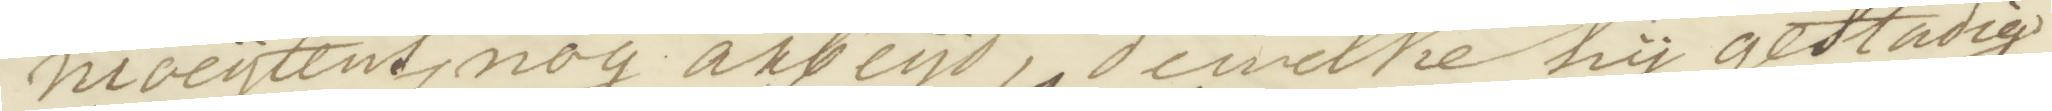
moeijtens, nog arbeijd, dewelke hij gestadig
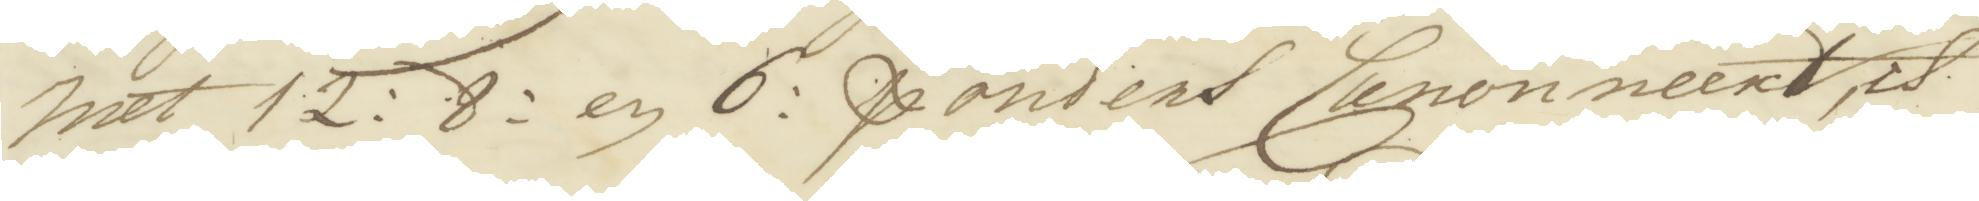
met 12: 8: en 6: ponders Canonneert, is
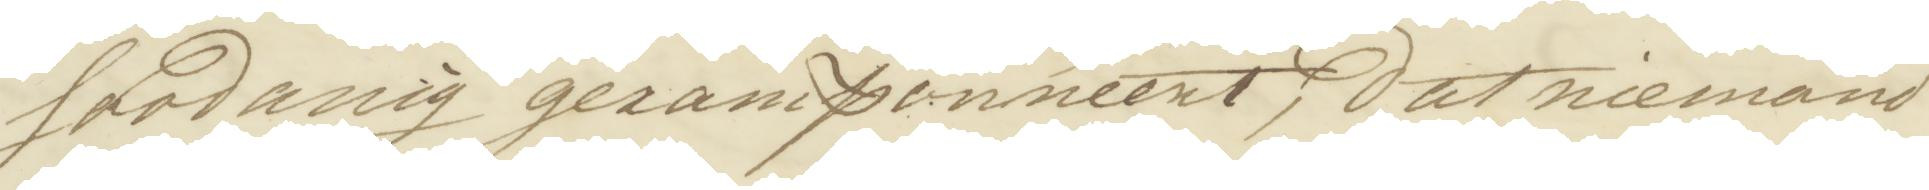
soodanig geramponneert, dat niemand
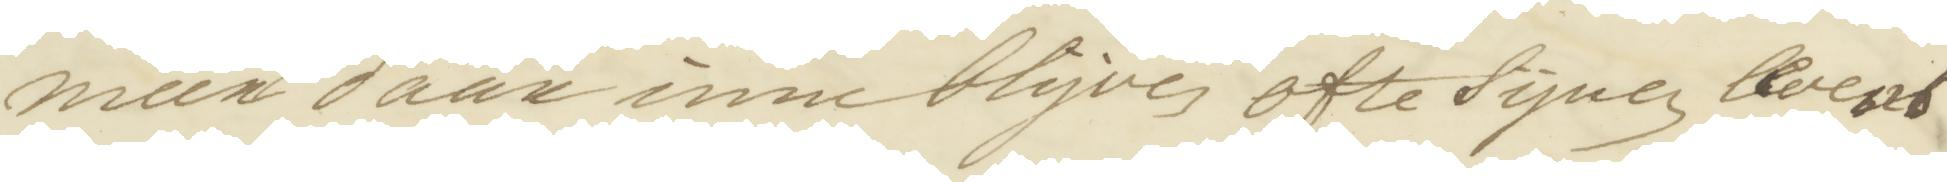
meer daar inne blijven ofte sijnen levens
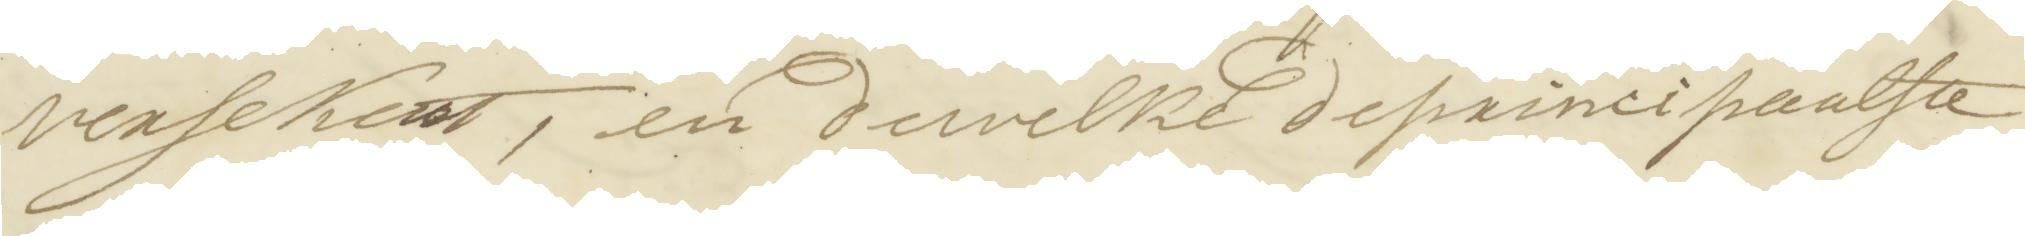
versekert, en dewelke de principaalste
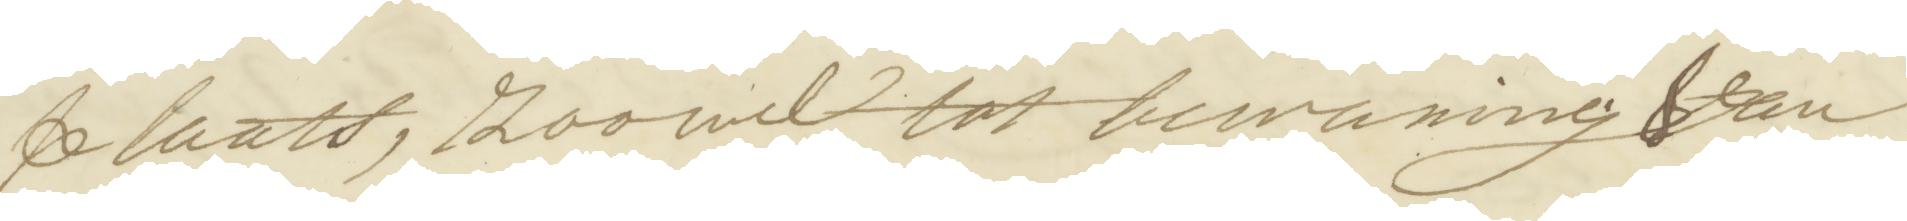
plaats, zoo wel tot bewaring van
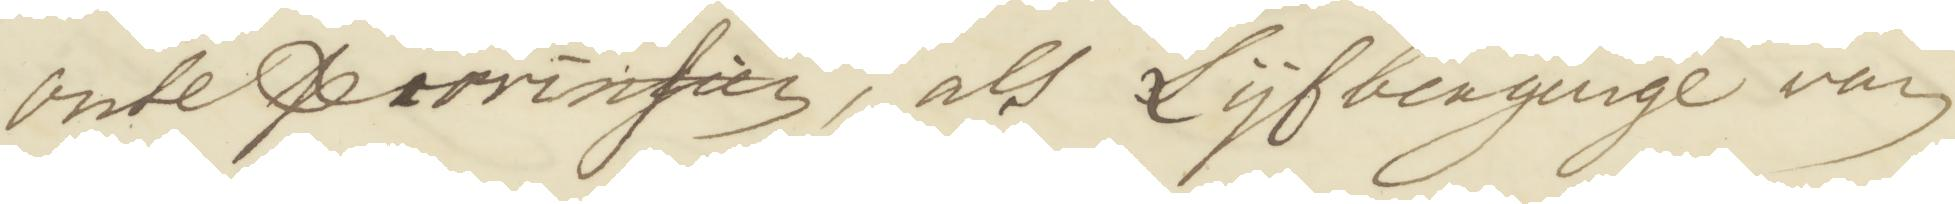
onse provinsien, als Lijfberginge van
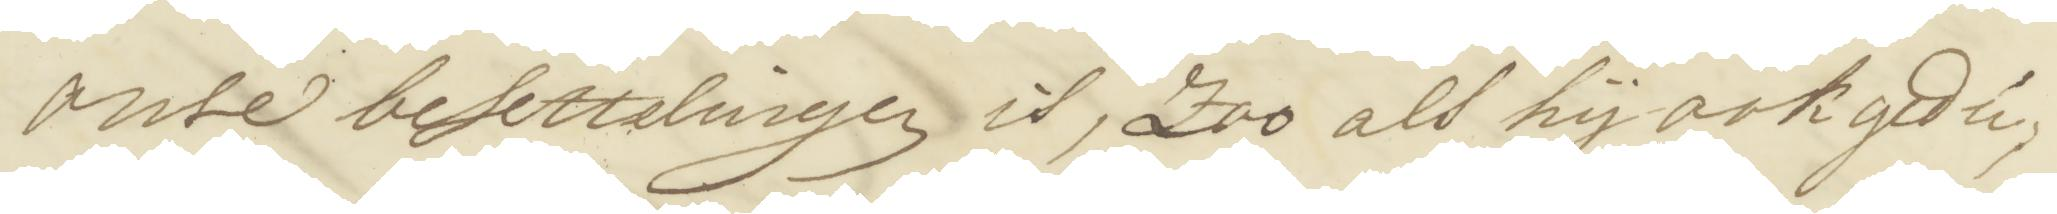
onse besettelingen is, zoo als hij ook gedu,
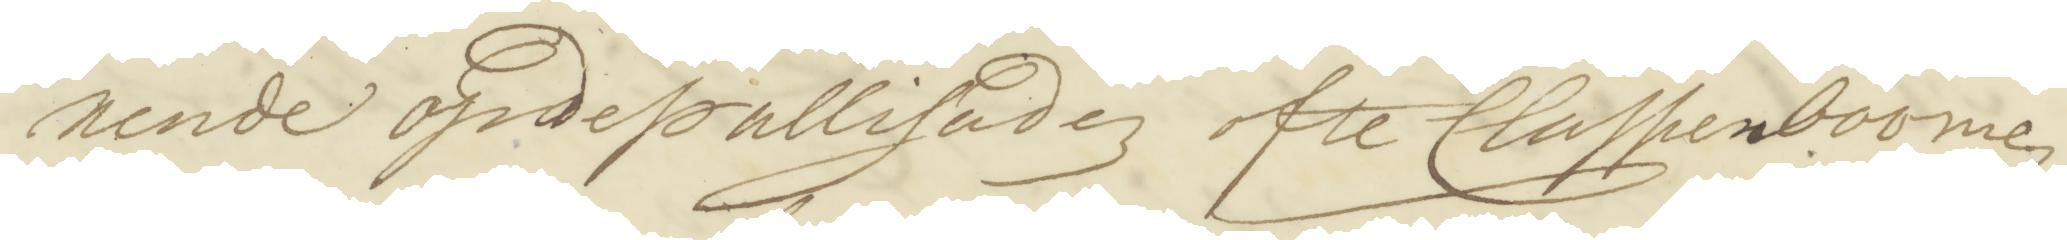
rende op de pallisaden ofte Clappenboomen,
